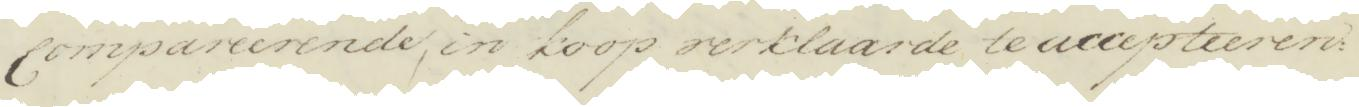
compareerende, in koop verklaarde te accepteeren:
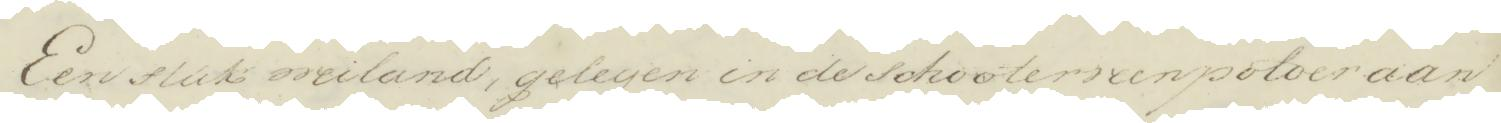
Een stuk weiland, gelegen in de schooterveenpolder aan
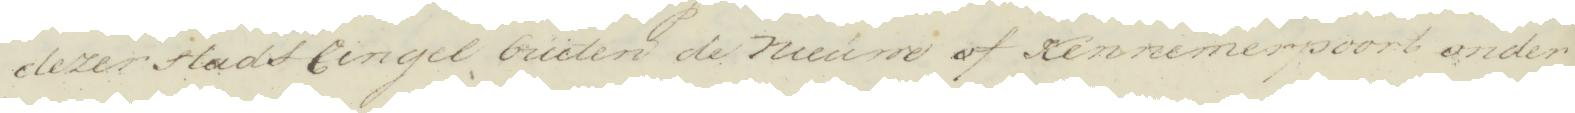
dezer stads Cingel, buiten de Nieuwe of Kennemerpoort onder
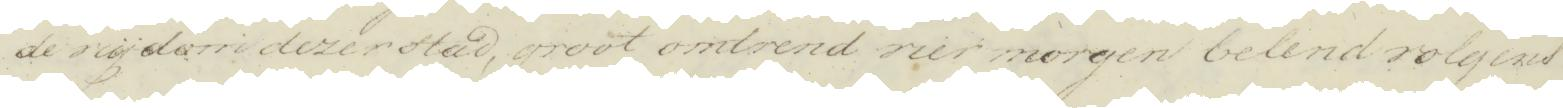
de vrijdom dezer stad, groot omtrend vier morgen belend volgens
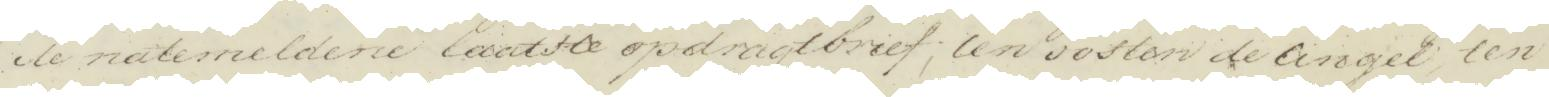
de natemeldene laatste opdragtbrief, ten oosten de cingel, ten
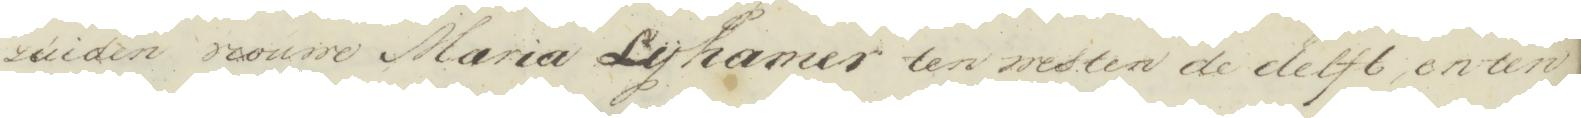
zuiden vrouwe Maria Lijhamer ten westen de delft, en ten
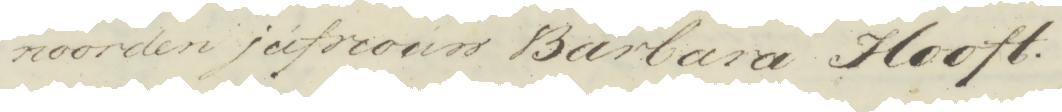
noorden jufvrouw Barbara Hooft.
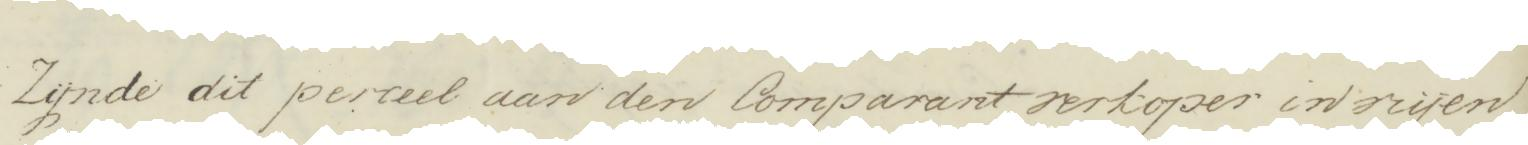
Zijnde dit perceel aan den Comparant verkoper in vrijen
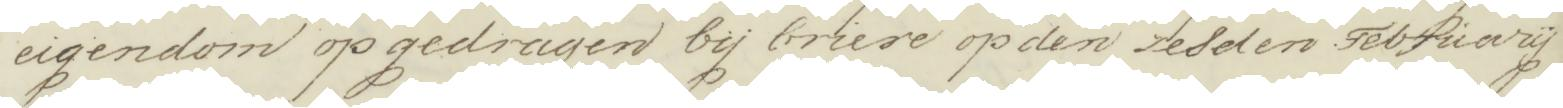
eigendom opgedragen bij brieve op den zesden Februarij
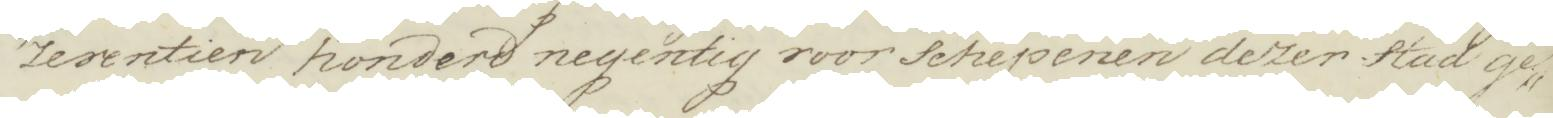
zeventien honderd negentig voor schepenen dezer stad ge„
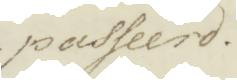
passeerd.
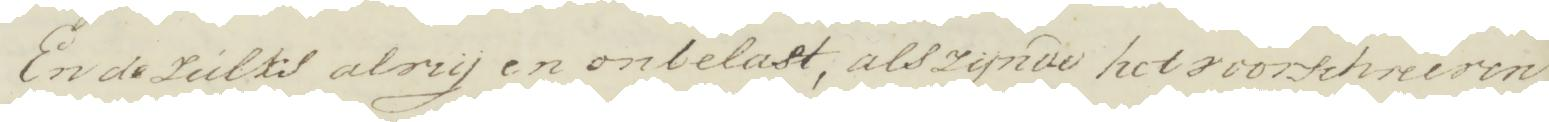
En de zulks alvrij en onbelast, als zijnde het voorschreeven
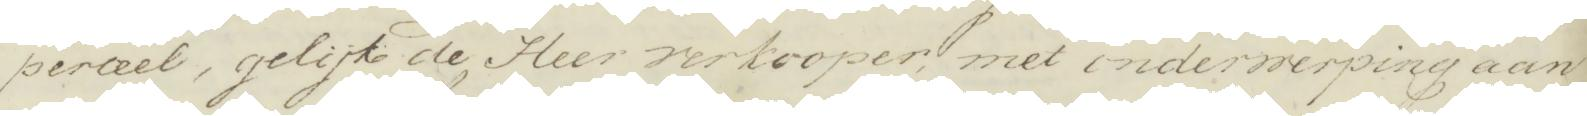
perceel, gelijk de Heer verkooper, met onderwerping aan
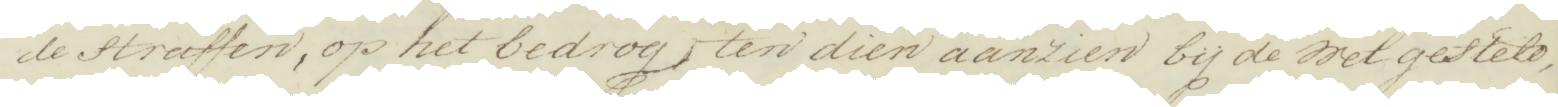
de straffen, op het bedrog, ten dien aanzien bij de wet gesteld,
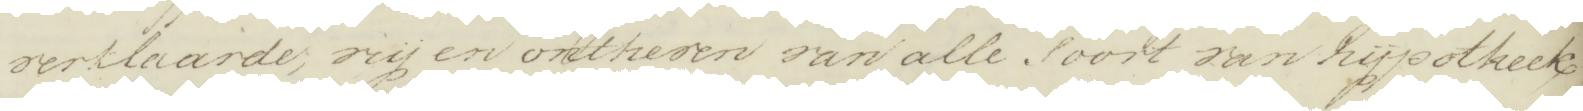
verklaarde, vrij en ontheven van alle soort van hijpotheek
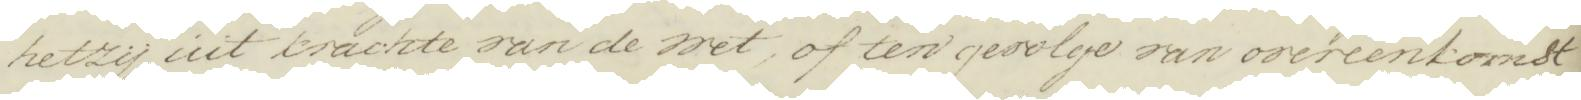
hetzij uit krachte van de wet, of ten gevolge van overeenkomst
